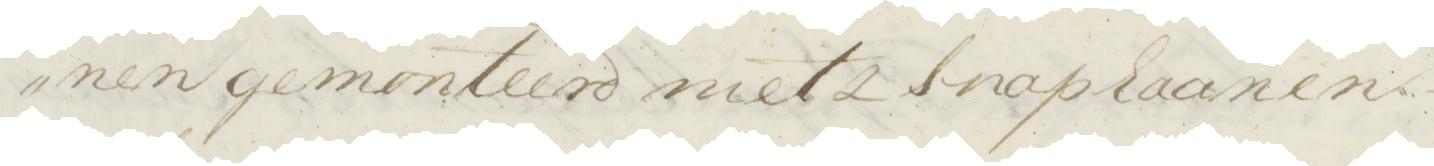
„nen gemonteerd met 2 snaphaanen.
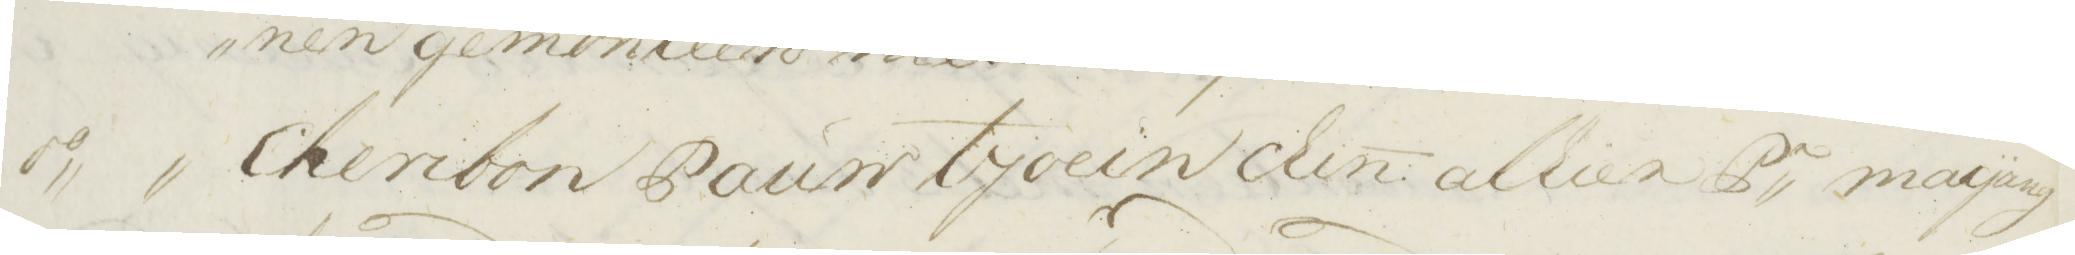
d„o „ cheribon Pauw tjoein chin: alhier P„r maijang
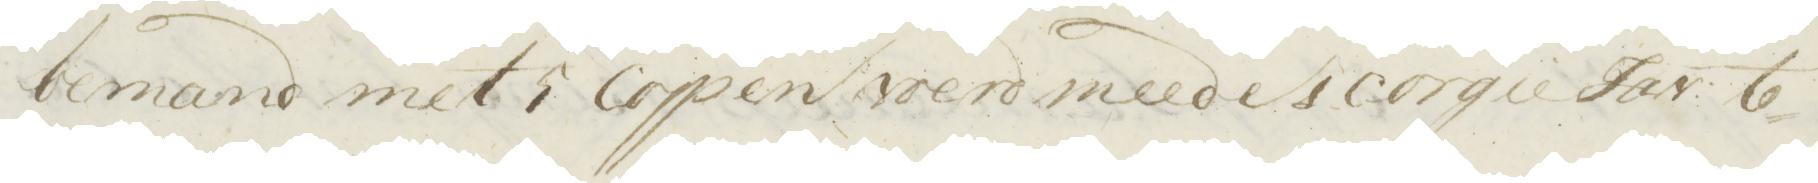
bemand met 5 coppen voerd meede 1 corgie Jav: to=
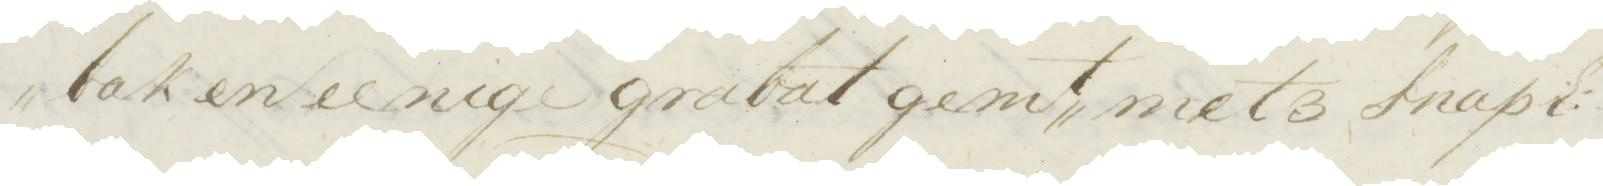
„bak en eenige grabat gem„t met 3 snaph:
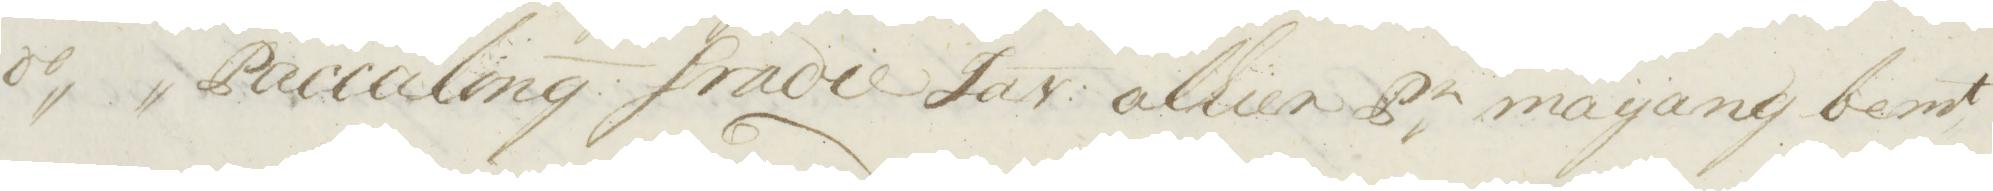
d„o „ Paccaling: sradie Jav: alhier P„r maijang bem„t
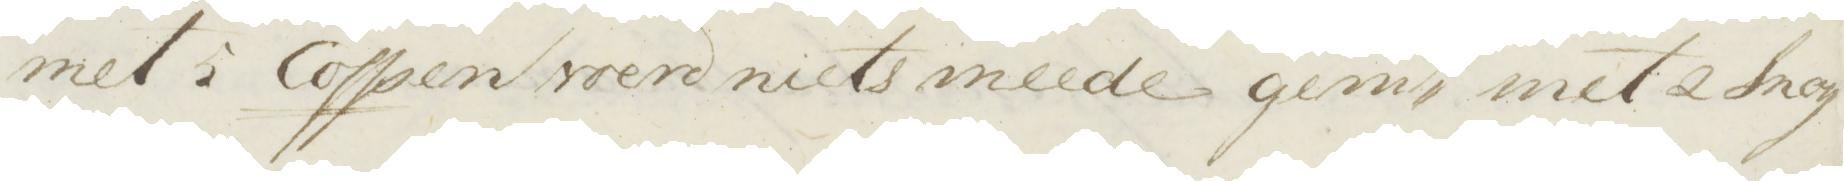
met 5 Coppen voerd niets meede gem„t met 2 snap
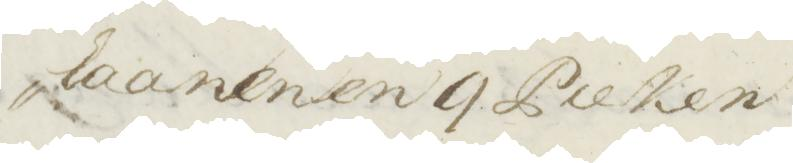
„haanen en 4. Pieken
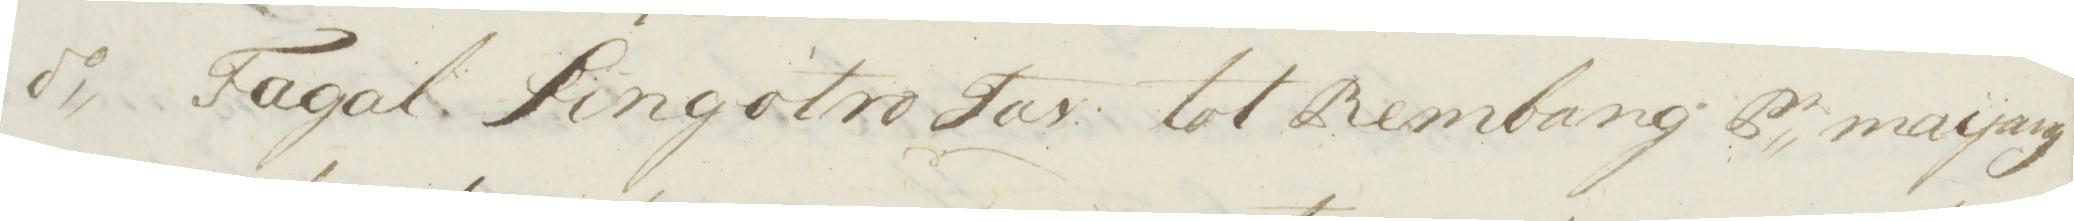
d„o Tagal Singotro Jav: tot Rembang P„r maijang
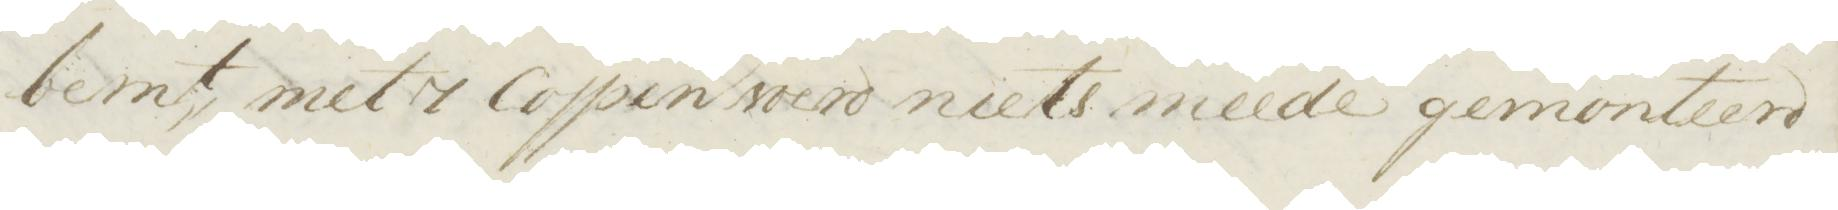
bem„t met 7 Coppen voerd niets meede gemonteerd
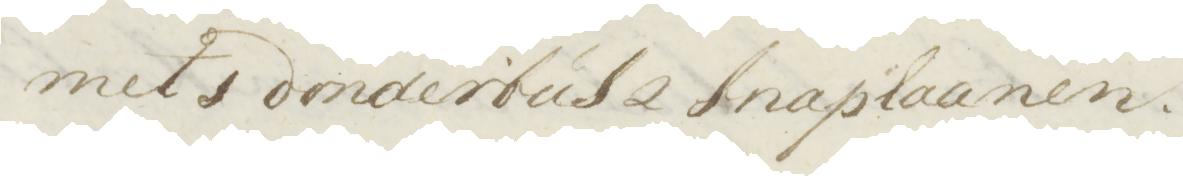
met 1 donderbus 2 snaphaanen.
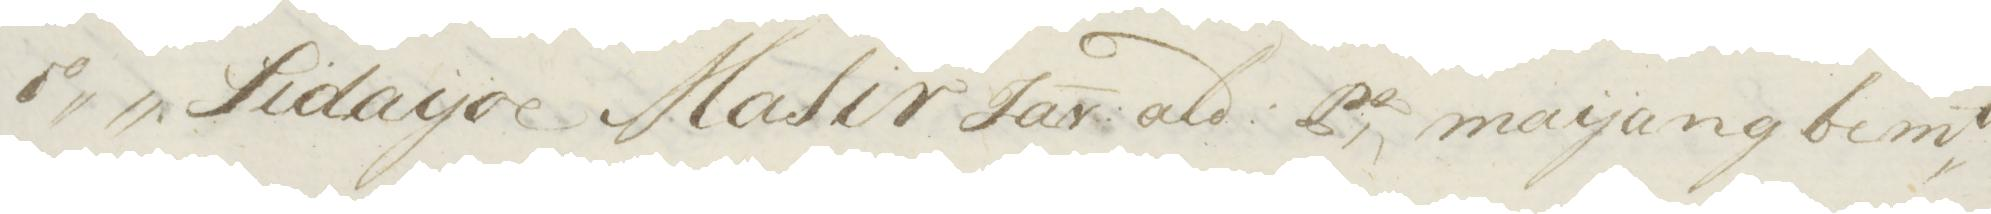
d„o „ Sidaijoe Masir Jav: ald: P„r maijang bem„t
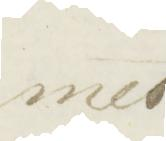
me
